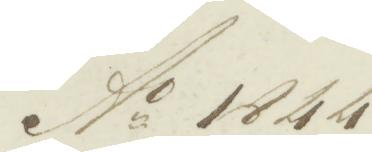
A=o 1844
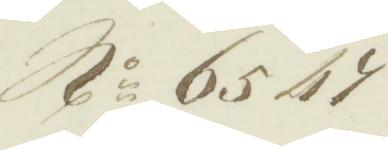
N=o 6547
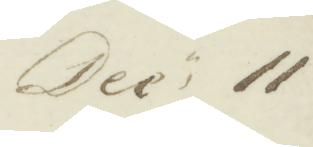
Dec; 11
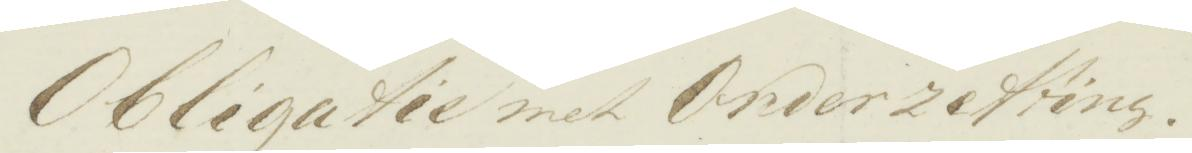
Obligatie met Onderzetting.
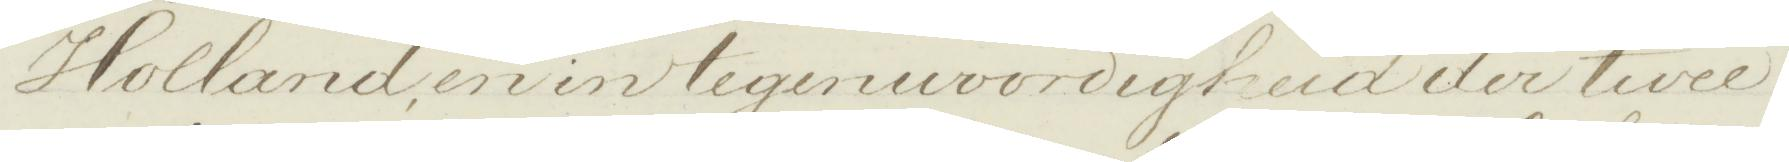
Holland, en in tegenwoordigheid der twee
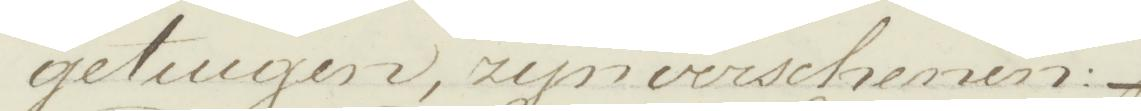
getuigen, zijn verschenen:-
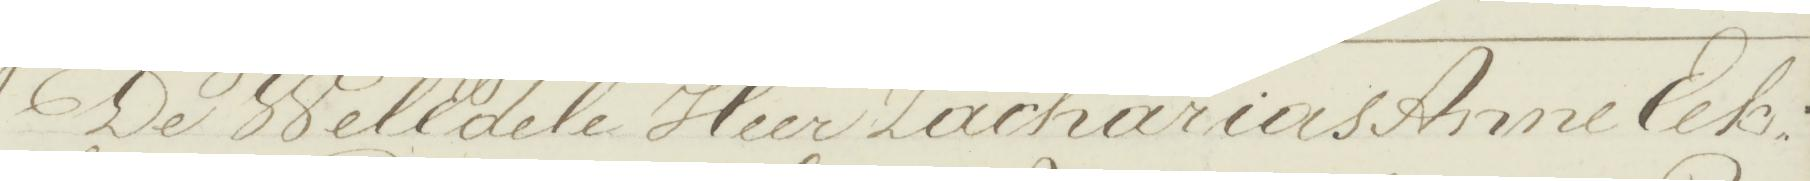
De WelEdele Heer Zacharias Anne Eek„
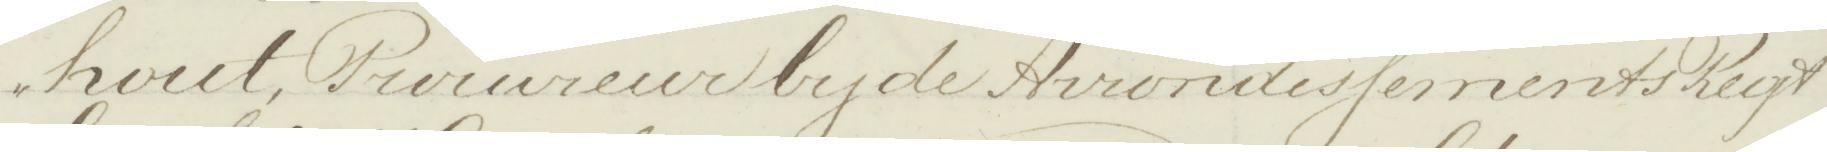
„hout, Procureur by de Arrondissements Regt
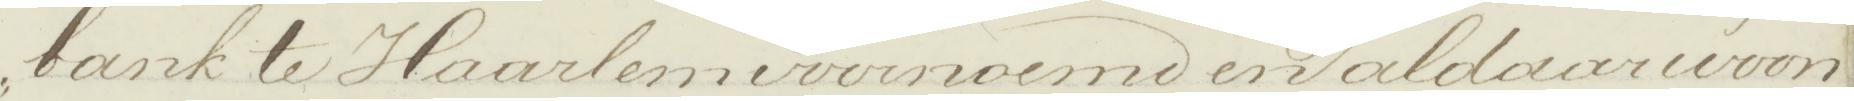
bank te Haarlem voornoemd en aldaar woon
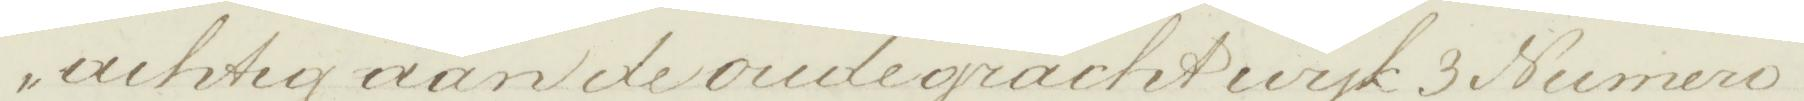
„achtig aan de oudegracht wyk 3 Numero
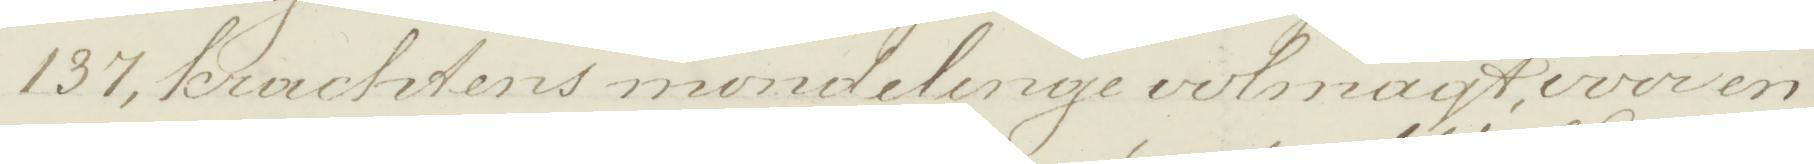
137, krachtens mondelinge volmagt, voor en
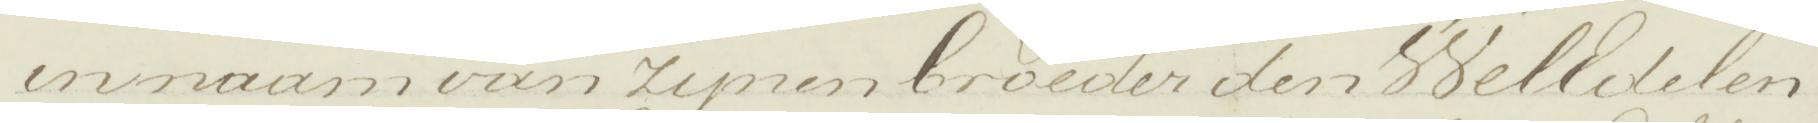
in naam van zynen broeder den WelEdelen
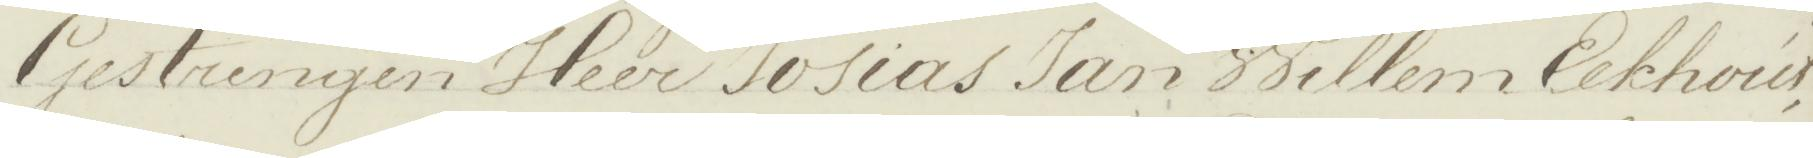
Gestrengen Heer Josias Ian Willem Eekhout,
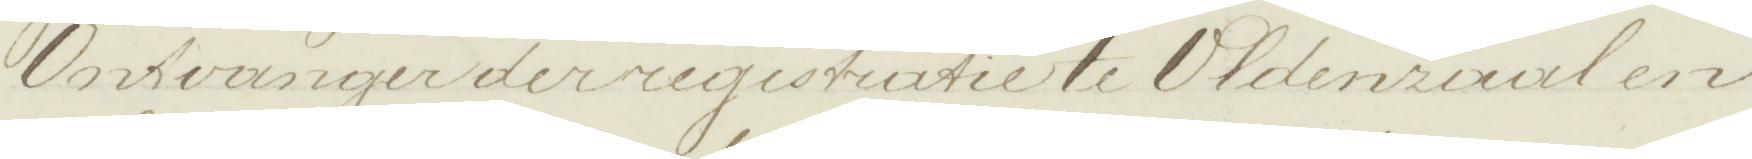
Ontvanger der registratie te Oldenzaal en
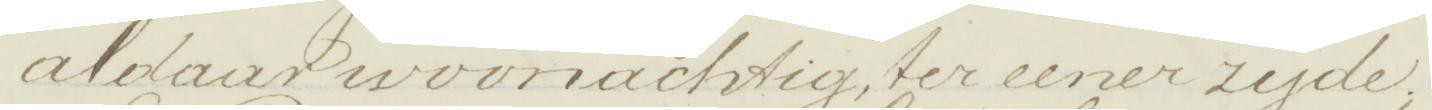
aldaar woonachtig, ter eener zyde;
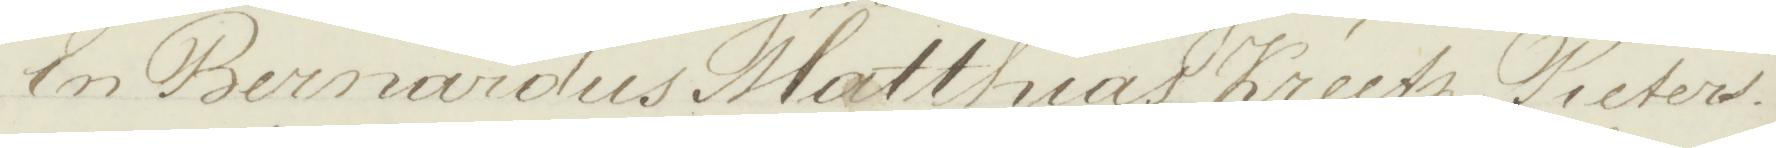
En Bernardus Matthias Kreets Pieters.
